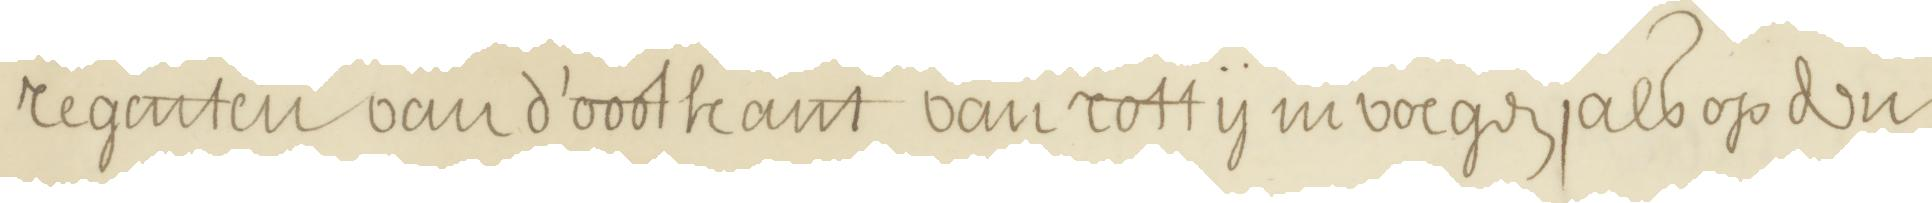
regenten van d’oostkant van rottij in voegen, als op den
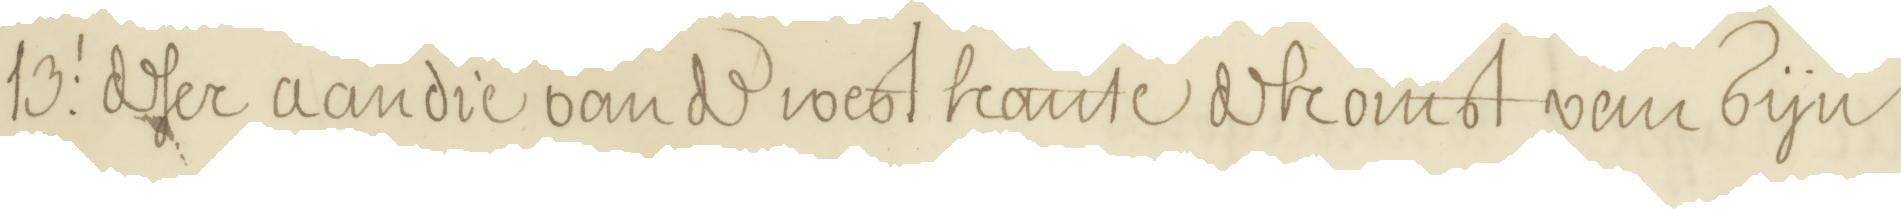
13:' deser aan die van de west kante dekomst van sijn
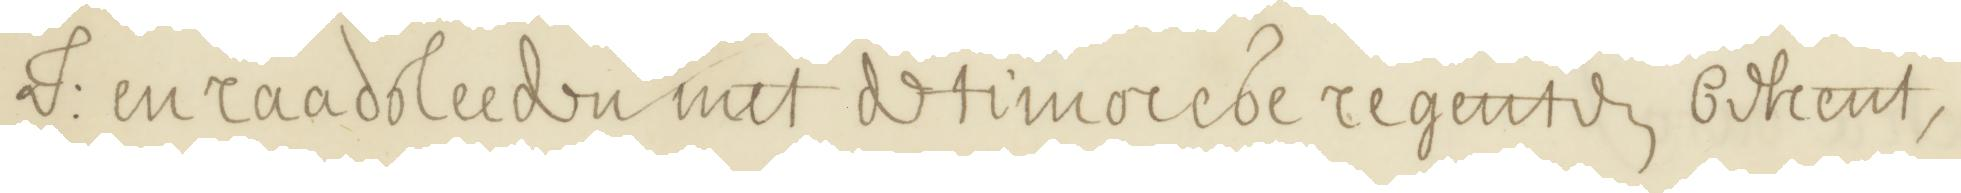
E: en raadsleeden met de timorese regenten bekent,
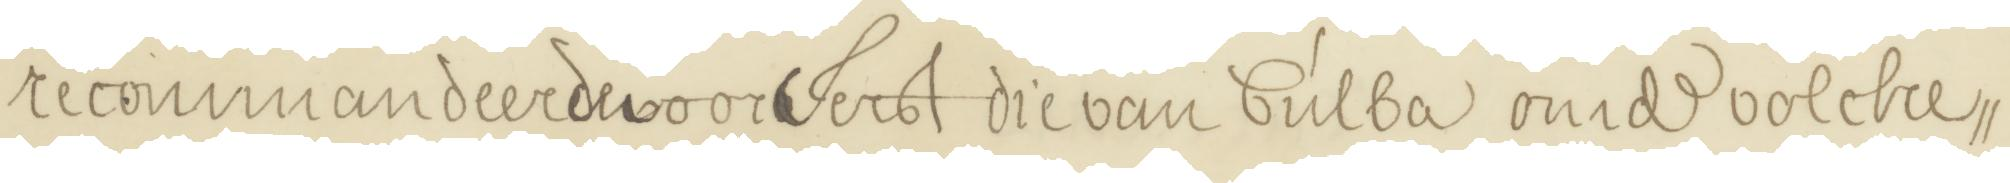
recommandeerdevoor Eerst die van bulba om de volcke„
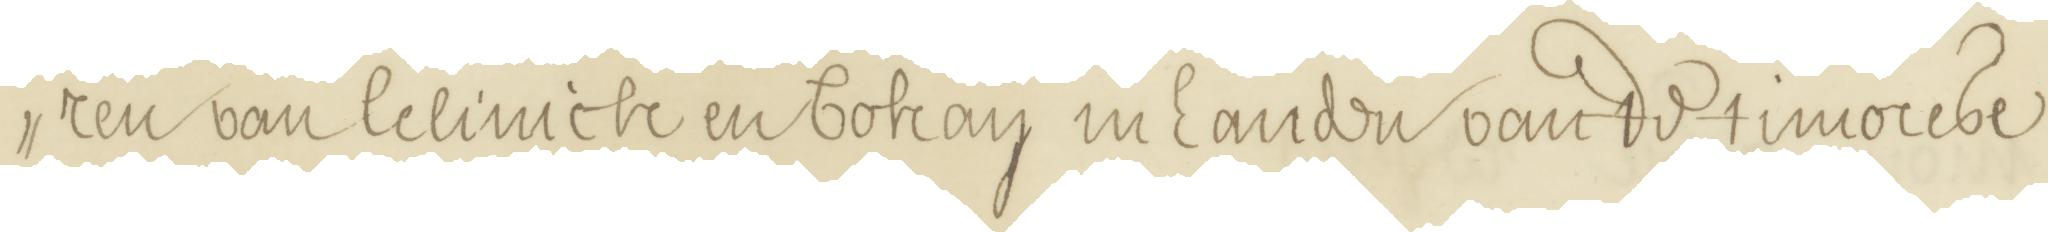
„ren van lelinick en bokaij in handen van de timorese
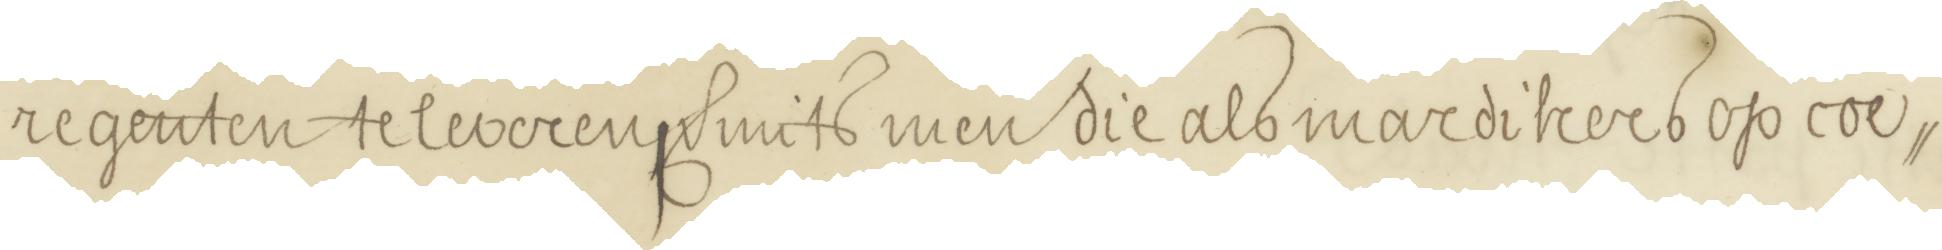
regenten te leveren, vermits men die als mardikers op coe„
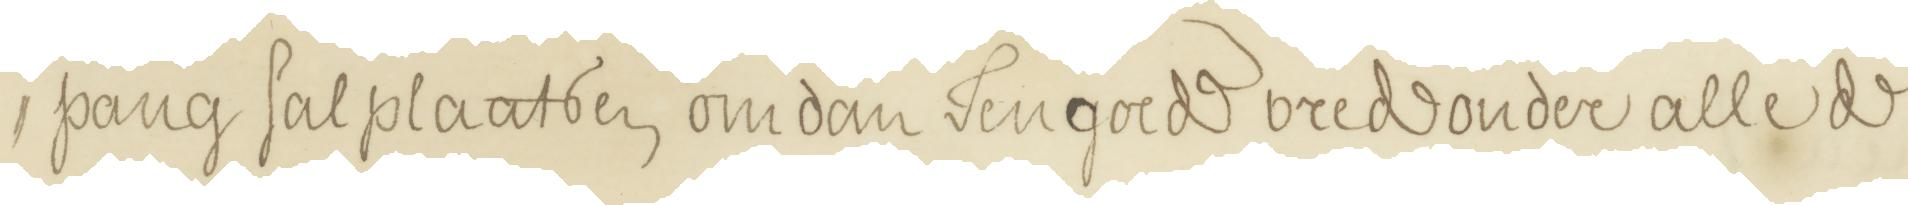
„pang sal plaatsen om dan Een goede vrede onder alle de
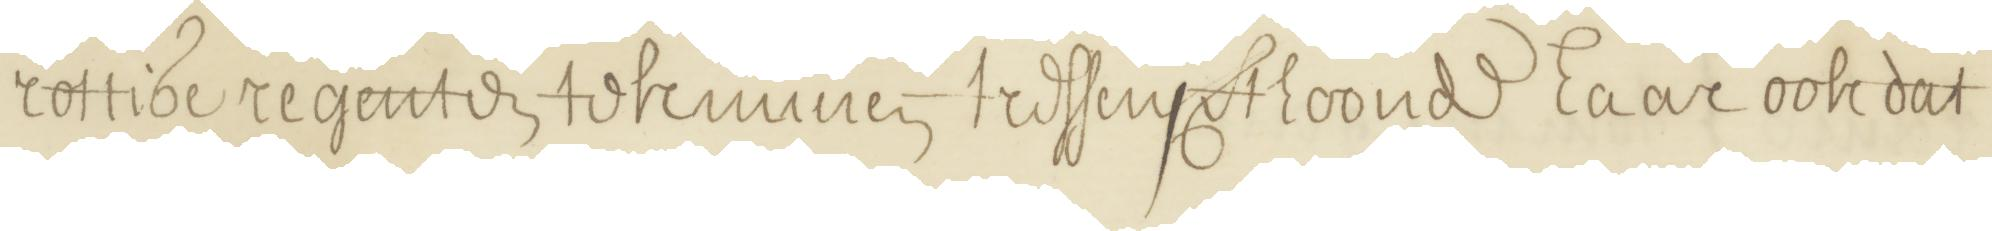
rottise regenten te kunnen treffen, verthoonde haar ook dat
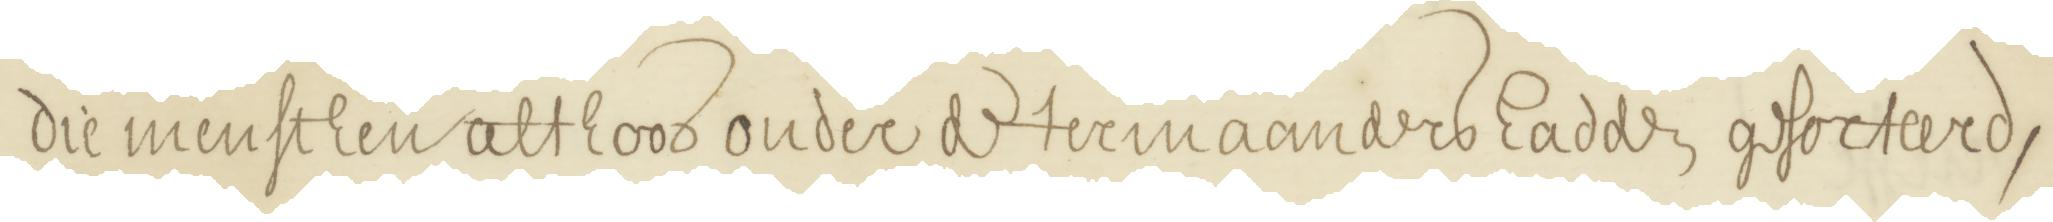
die mensthen althoos onder de termaanders hadden gesorteerd,
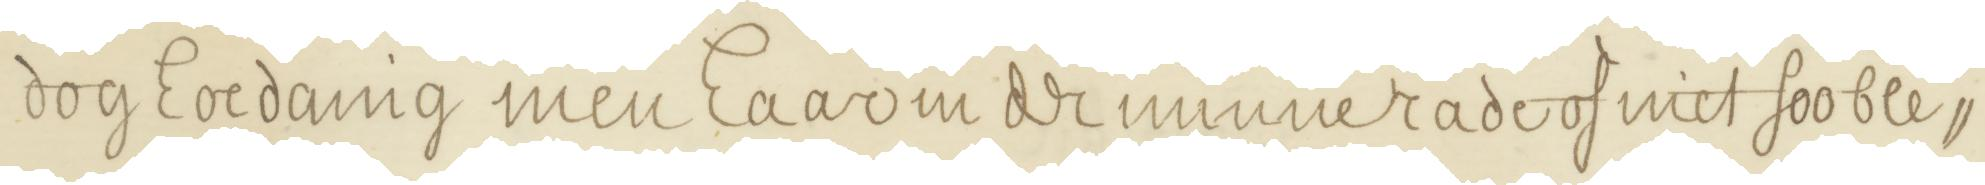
dog hoedanig men haar in der minnerade of niet soo ble„
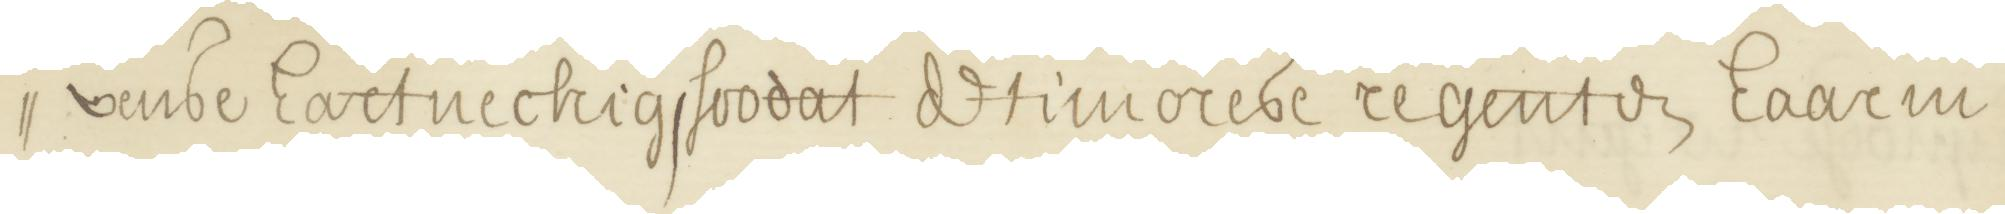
„vense hartneckig, soo dat de timorese regenten haar in
